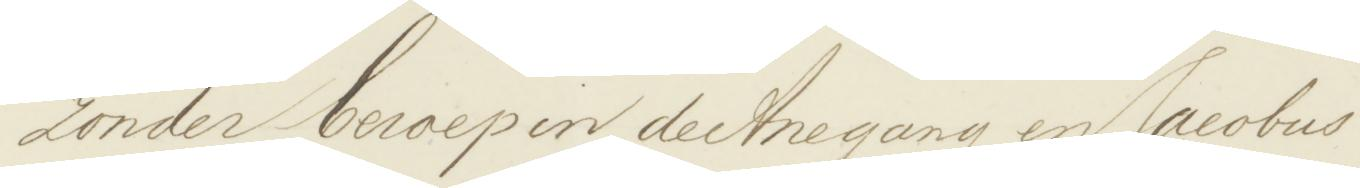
zonder beroep in de Anegang en Jacobus
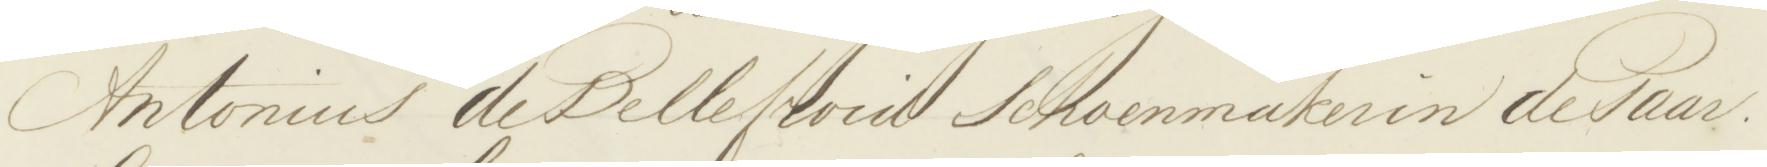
Antonius de Bellefroid Schoenmaker in de Paar.
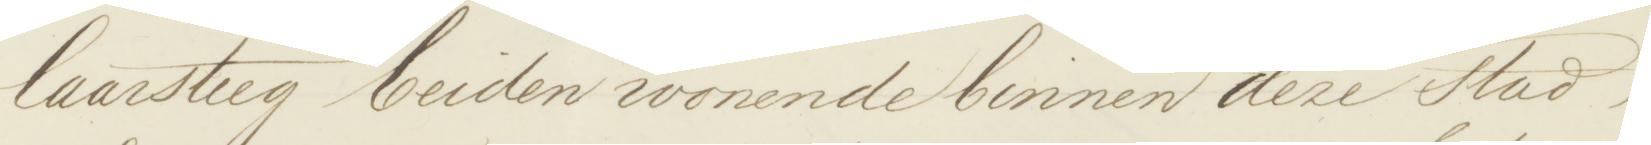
laarsteeg beiden wonende binnen deze stad,
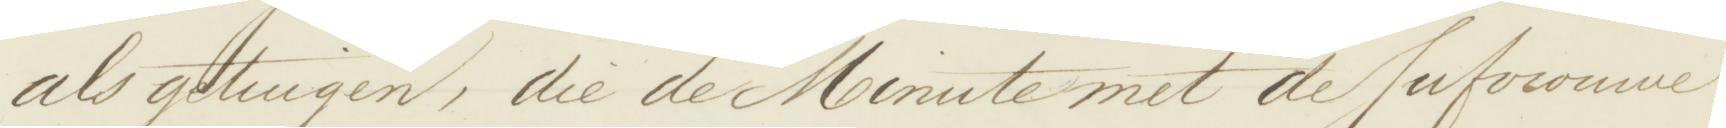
als getuigen, die de Minute met de Jufvrouwe
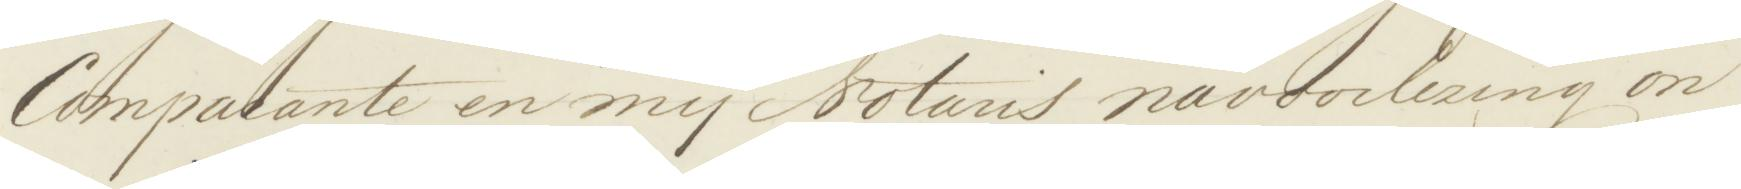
Comparante en my Notaris na voorlezing on
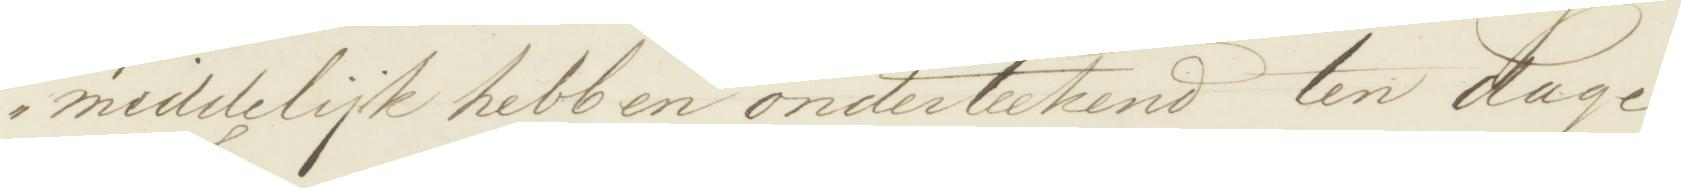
„middelijk hebben onderteekend ten dage
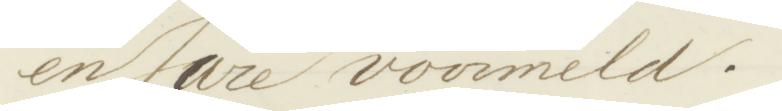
en Jare voormeld.
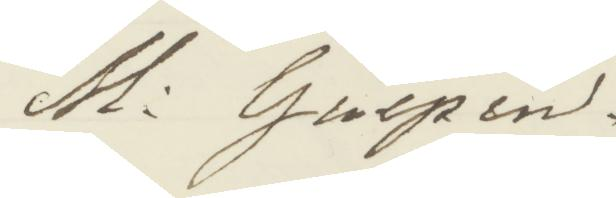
M: Guepin.
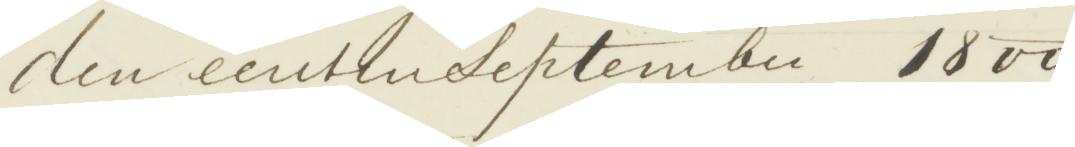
den eersten september 1800
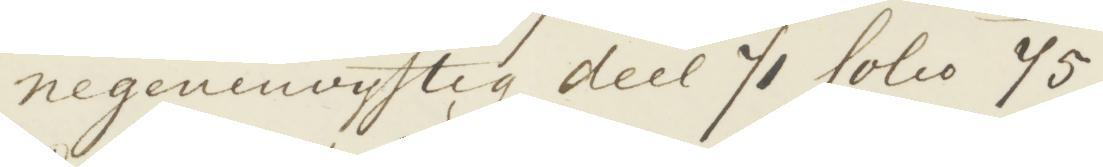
negenenvyftig deel 70 folio 75
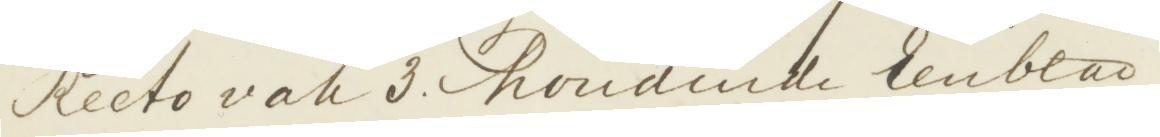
Recto vak 3. houdende Een blad
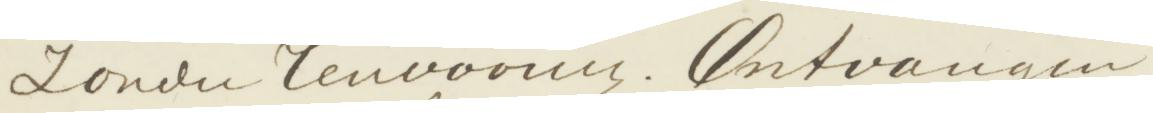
Zonder renvooien Ontvangen
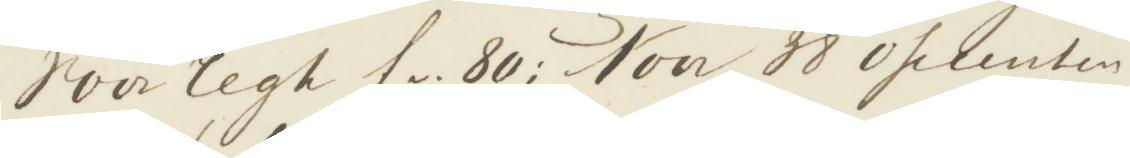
Voor regt ƒ. 80; Voor 88 opcenten
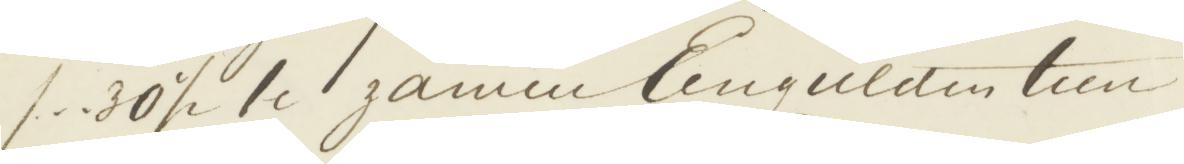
ƒ.. 30½ te zamen Een gulden tien
